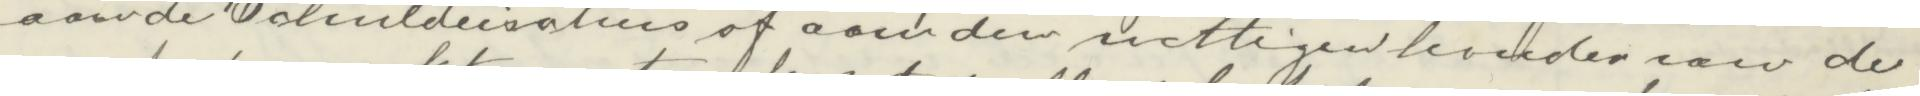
aan de schuldeischers of aan de wettigen houder van de
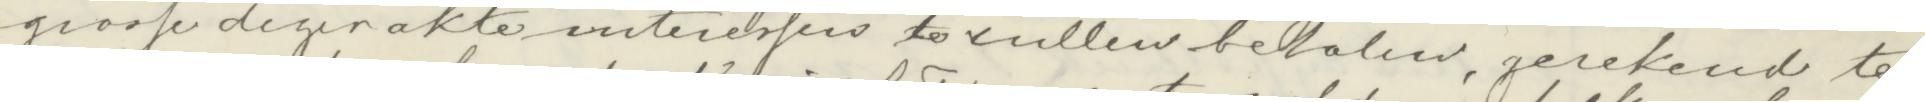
grosse dezer akte interessen te zullen betalen, gerekend te
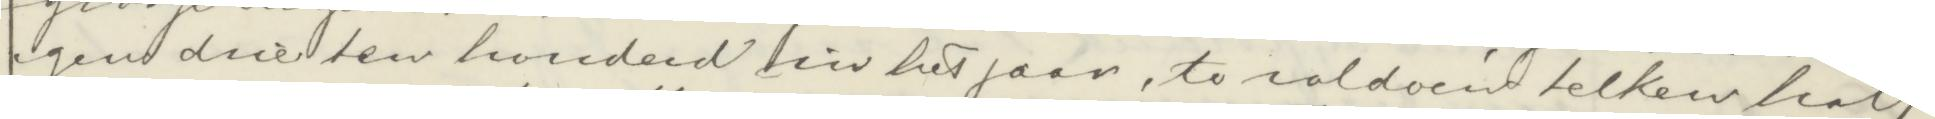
gen drie ten honderd in het jaar, te voldoen telken half
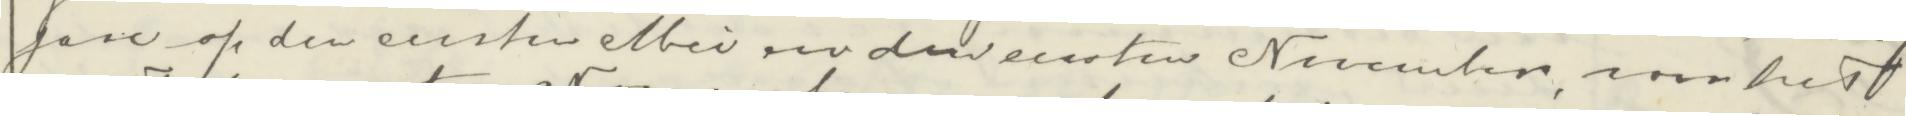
jare op den eersten Mei en en eersten November, voor het
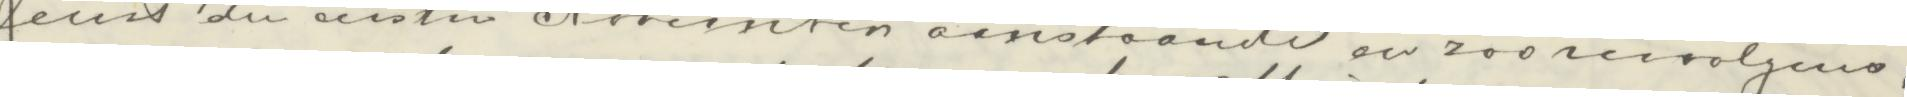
eerste den eersten November aanstaande en zoo vervolgens
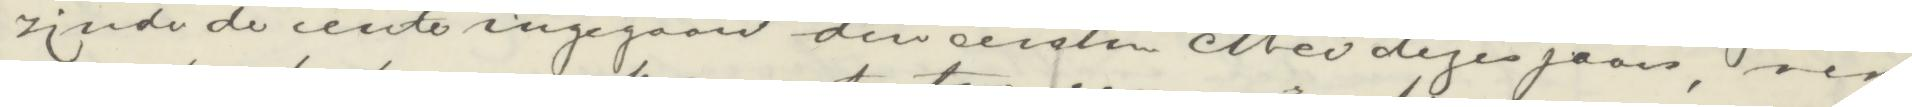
zjnde de rente ingegaan den eersten Mei dezes jaars, ver
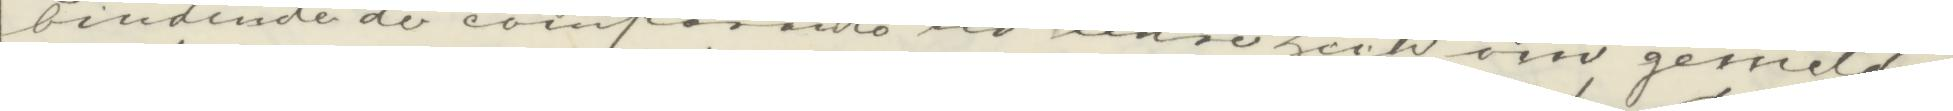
bindende de comparante ter eenre zich om gemelde
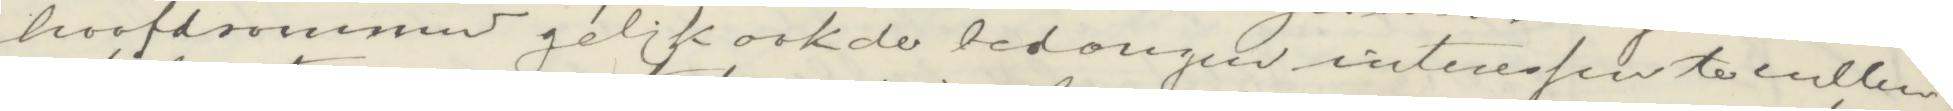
hoofdsommen gelijk ook de bedongen interessen te zullen
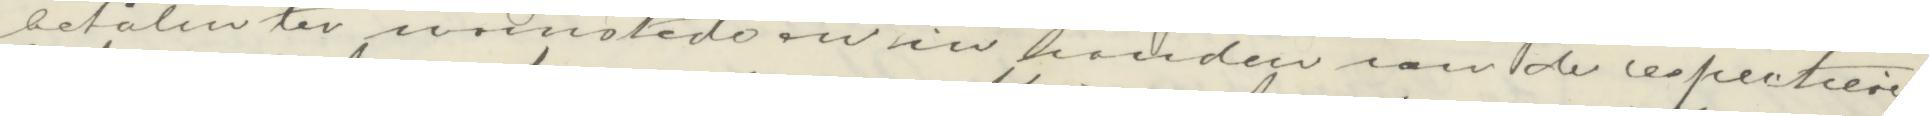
betalen ten minste doen inhouden van de respectieve
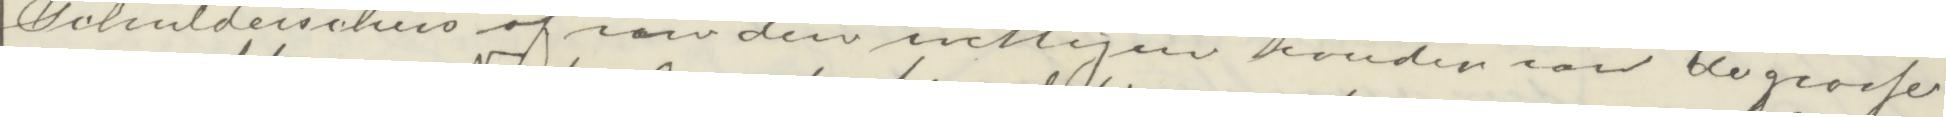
Schuldeischers of van den wettigen houder van de grosse
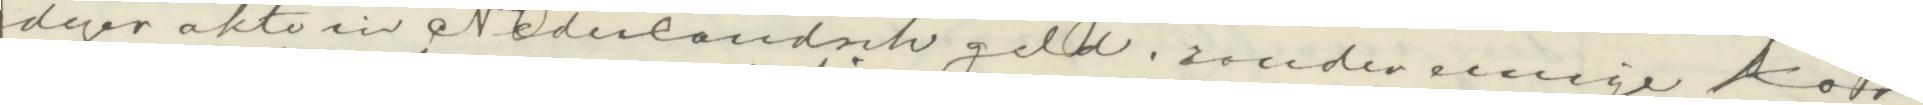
dezer akte in Nederlandsch geld, zonder eenige kor,
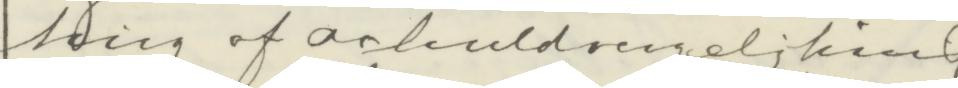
ting of schuldvergelijking
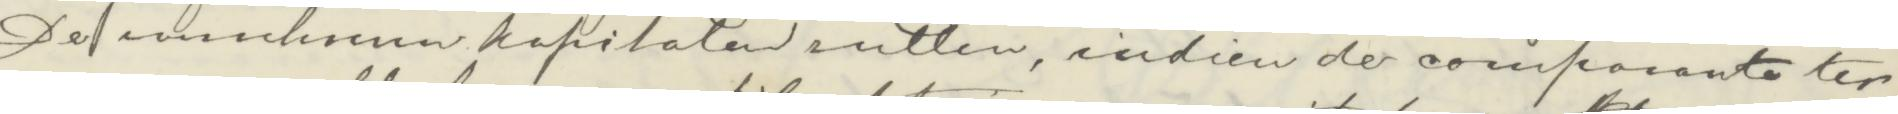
De verschenen kapitalen zullen, indien de comparante ter
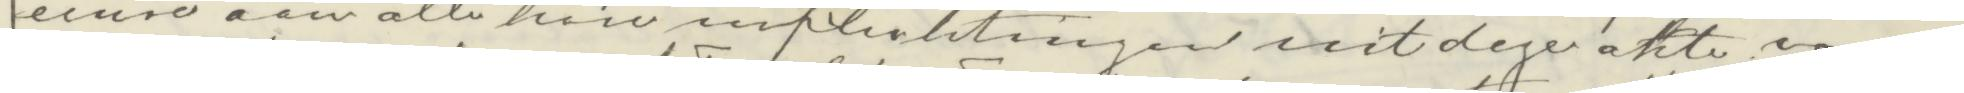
eenre aan alle hare verplichtingen uit deze akte voert
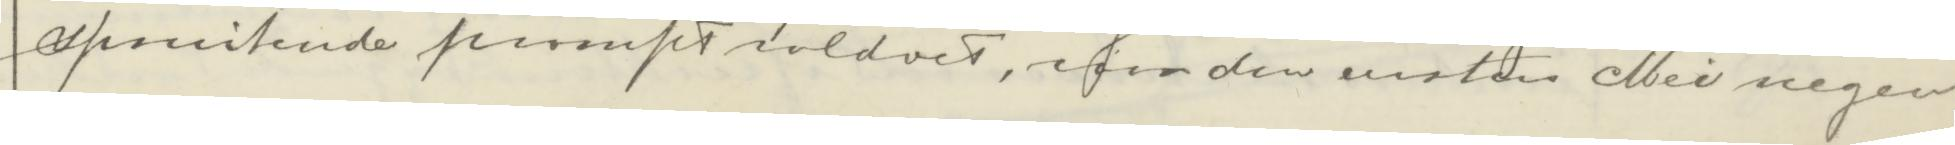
spruitende prompt voldoet, van den eersten Mei negen
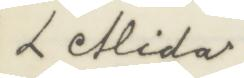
¶ Alida
